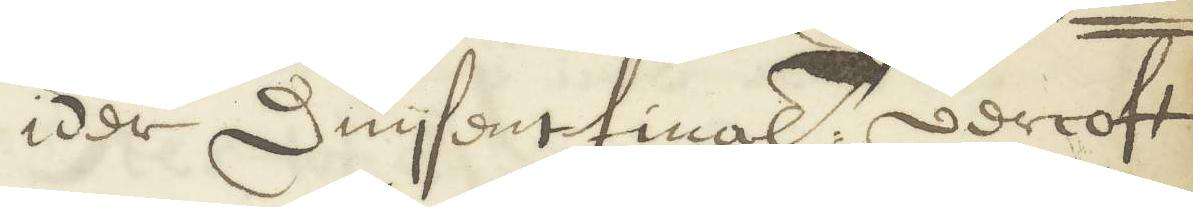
ider Duijsent finalijk vercoft
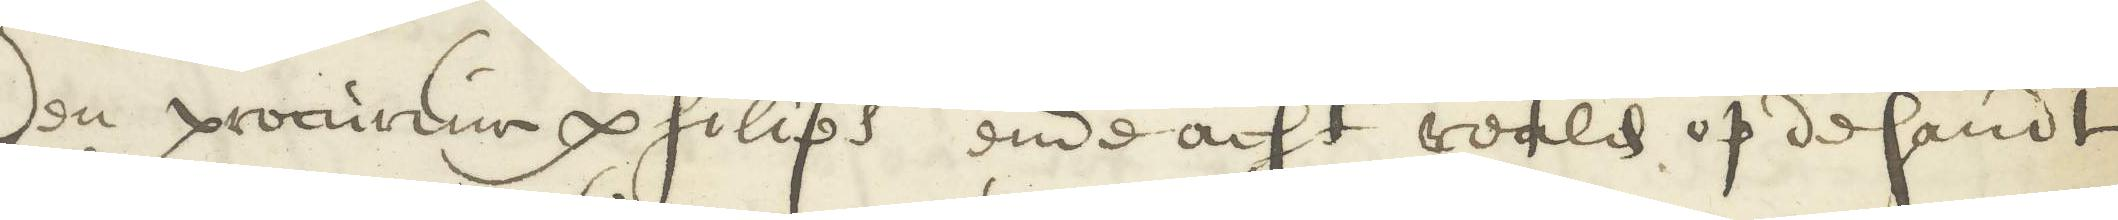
den procureur philips ende acht realen op de handt
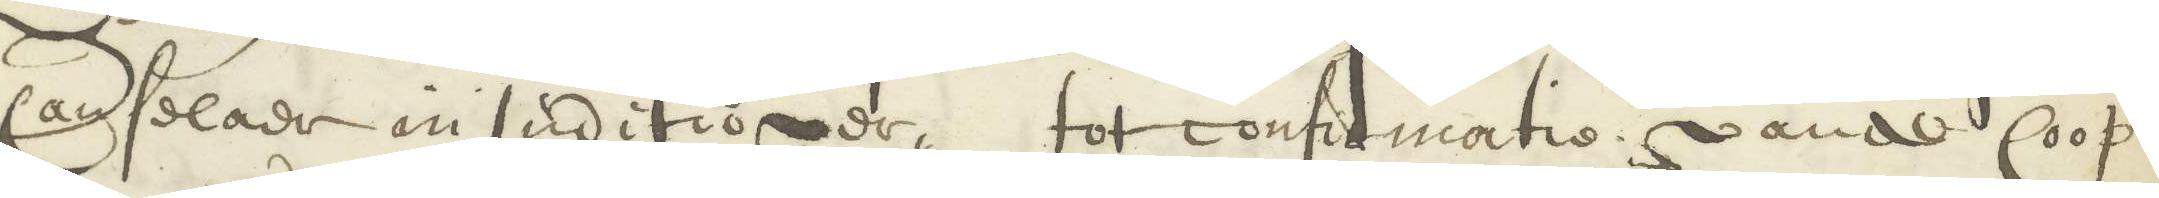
Canselaer in Juditio ver„ tot confirmatie vande Coop
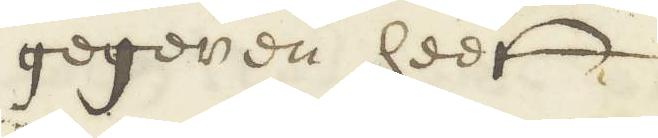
gegeven heeft
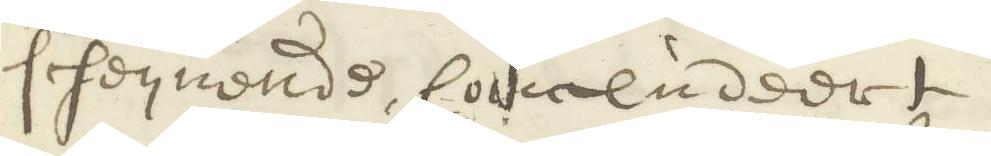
scheynende, Concludeert
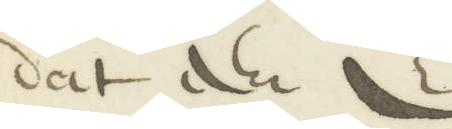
dat den Eys=r ( alsoo syn
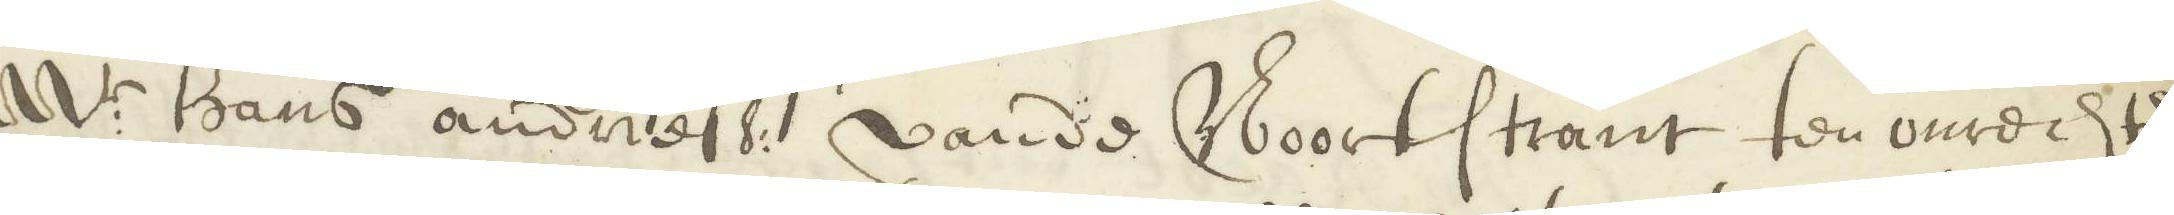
M:r hans andriess: van de Noortstrant ten onrechten
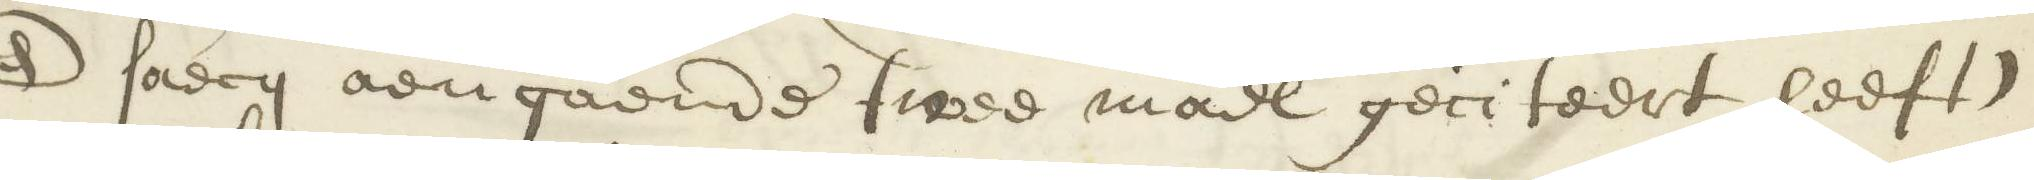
den saecq aengaende twee mael geciteert heeft)
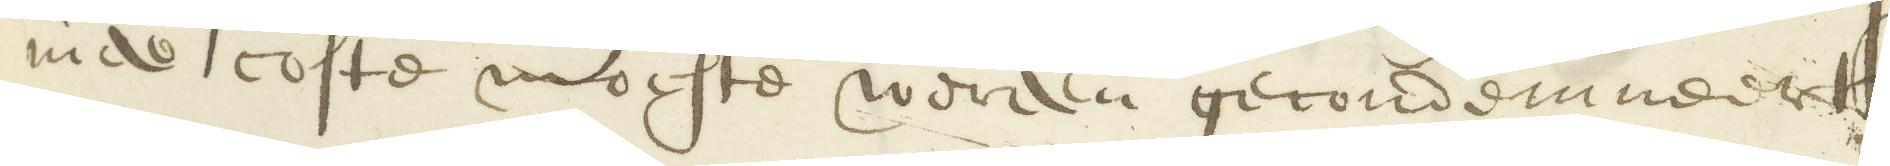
in de coste mochte werden gecondemneerd
